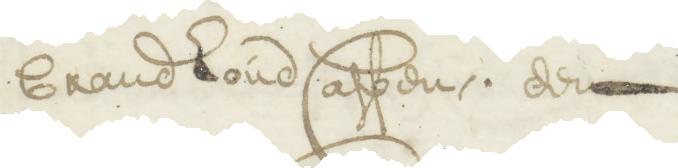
brandhoud Cappen,. den
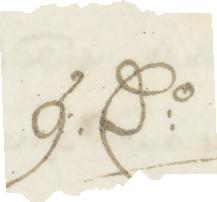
9:e D:o
